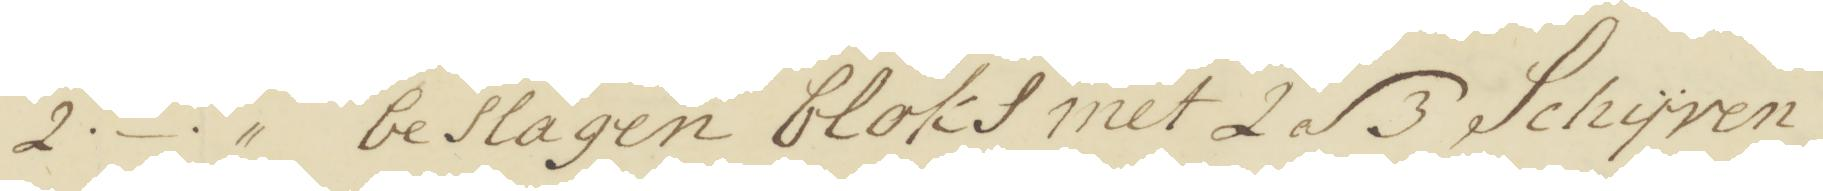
2.–. „ beslagen bloks met 2 a 3 schijven
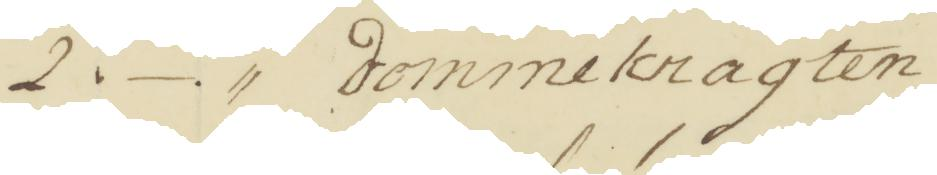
2.–. „ dommekragten
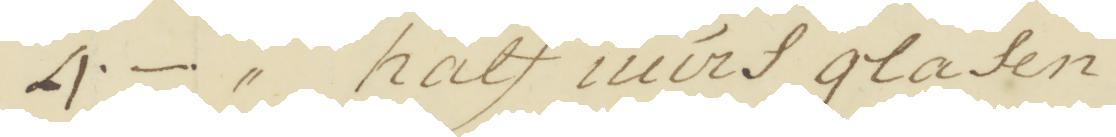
4.–. „ half uurs glasen
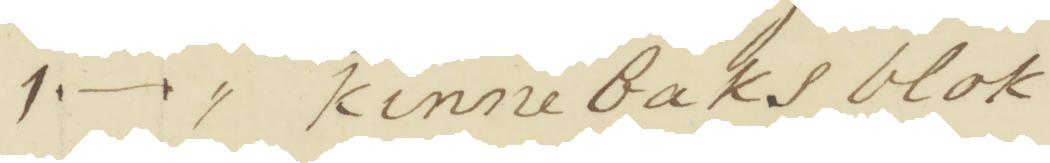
1.–. „ kinnebaks blok
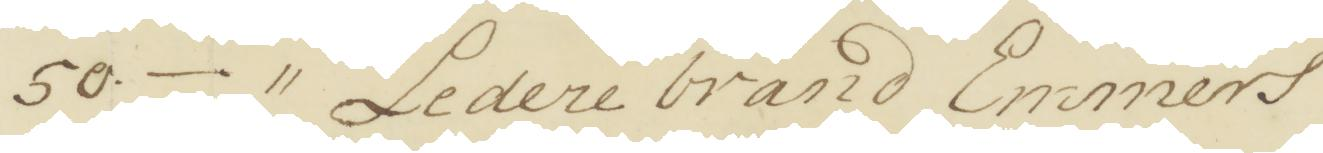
50.–. „ Ledere brand Emmers
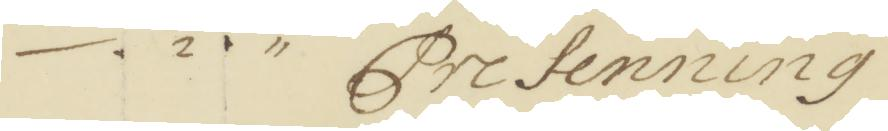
–. ½ . „ Presenning
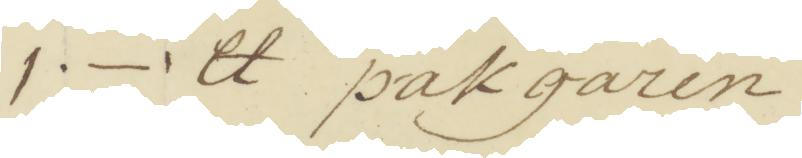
1.–. lb pakgaren
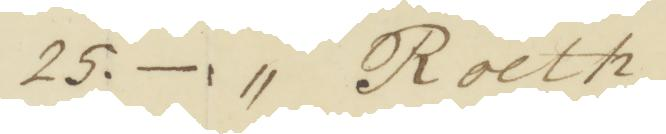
25.–. „ Roeth
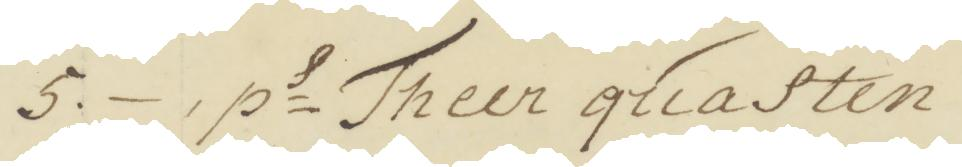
5.–. p=s Theer quasten
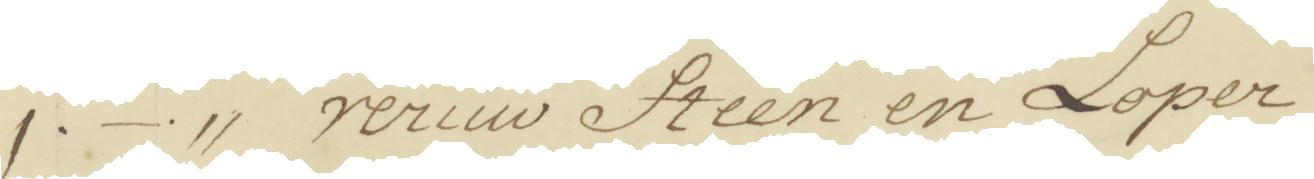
1.–. „ veruw steen en Loper
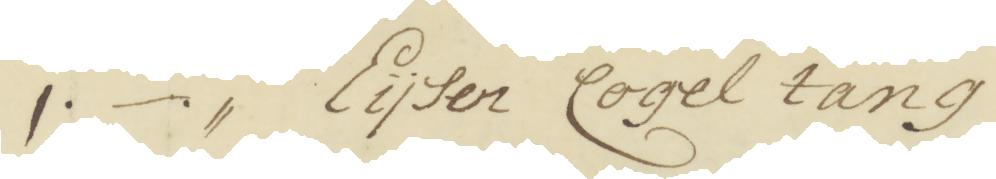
1.–. „ Eijser cogel tang
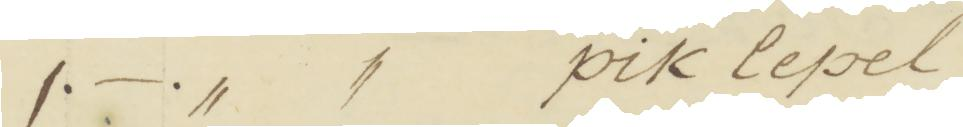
1.–. „ „ pik lepel
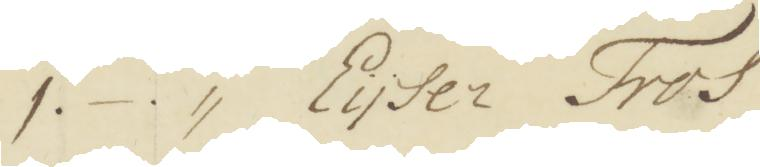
1.–. „ Eijser Tros
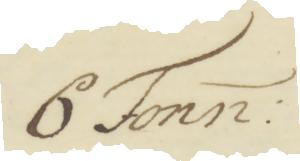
6 Tonn:
